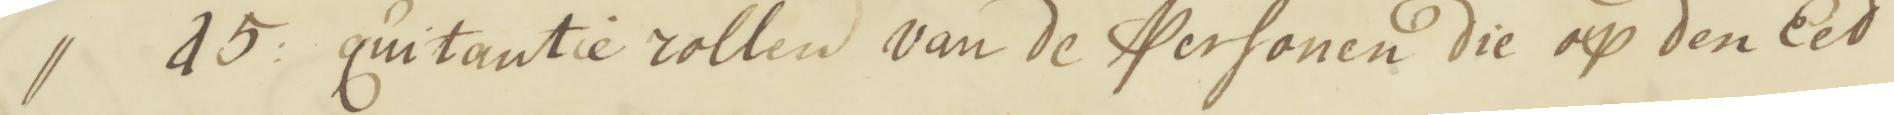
„ 45: quitantie rollen van de personen die op den Eed
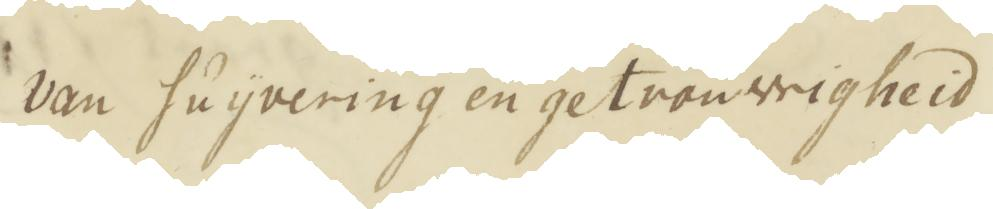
van suijvering en getrouwigheid
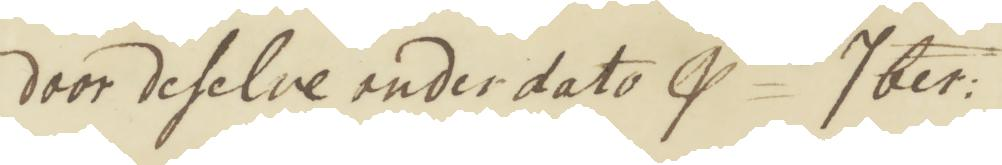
door deselve onder dato p=mo 7ber:
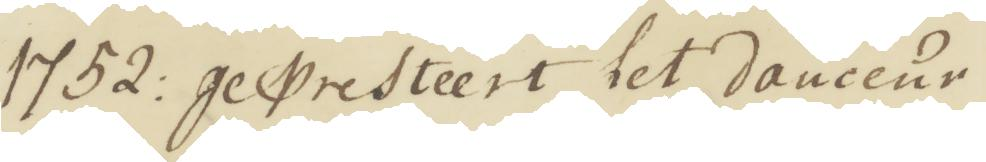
1752: gepresteert het douceur
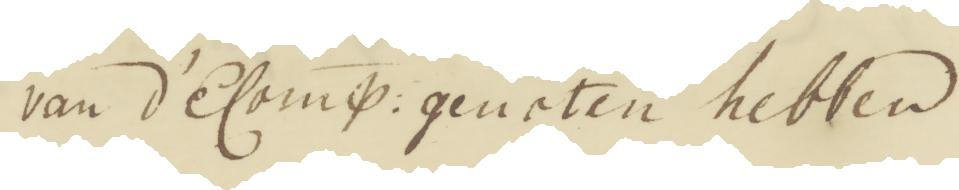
van d’EComp: genoten hebben
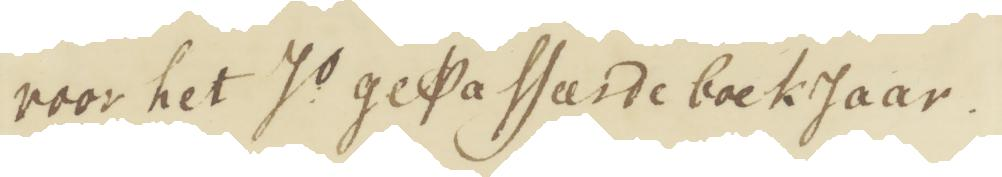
voor het J:o gepasseerde boekjaar.
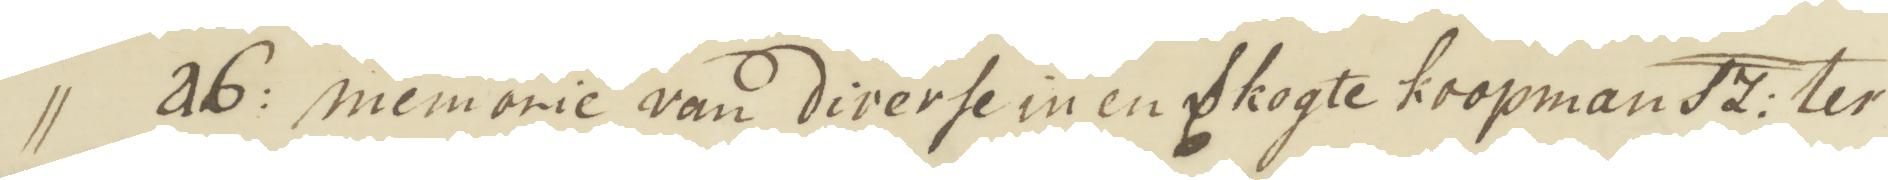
„ 46: memorie van diverse in en verkogte koopmansz: ter
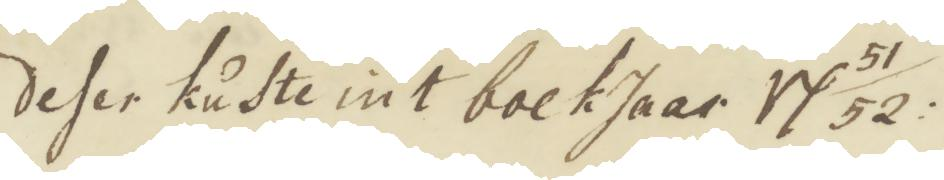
deser kuste in’t boekjaar 1751/52:
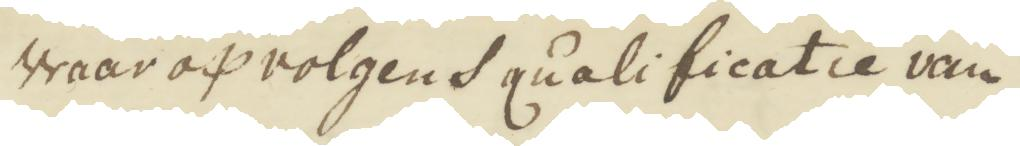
waar op volgens qualificatie van
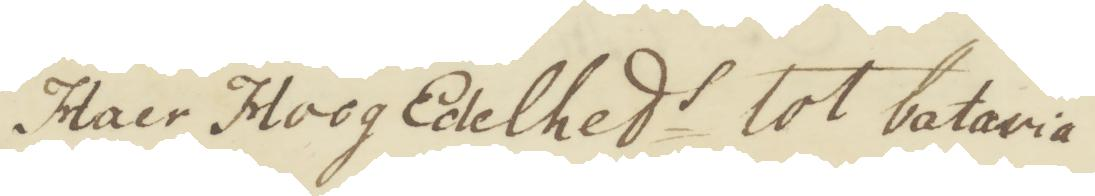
Haer Hoog Edelhed=s tot batavia
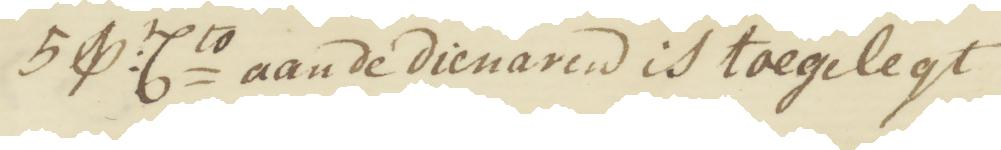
5 p:rC=to aan de dienaren is toegelegt
